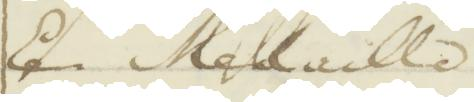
Een Medaille
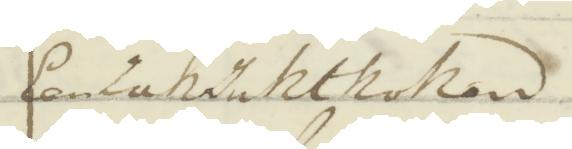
Een zakintkoker
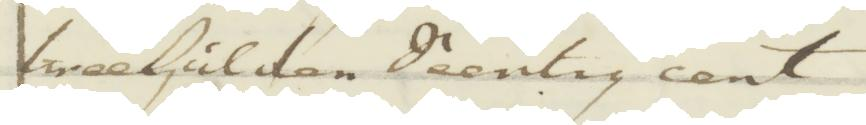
twee Gulden Veertig cent
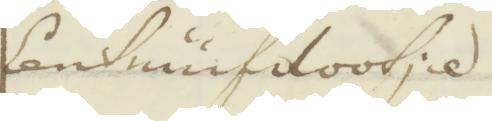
Een snuifdoosje
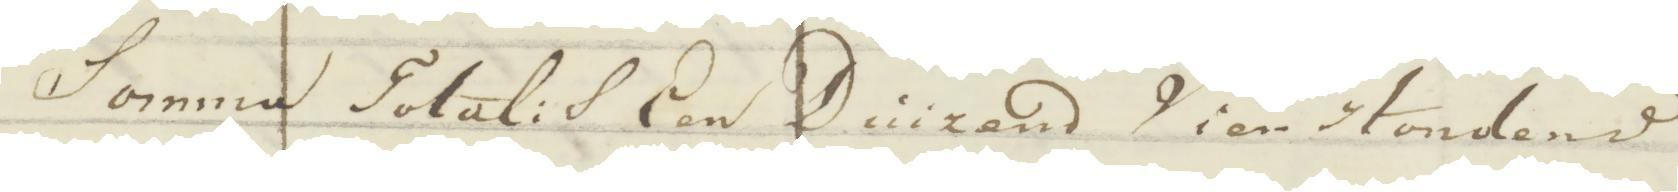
Somma Totalis Een Duizend Vier Honderd
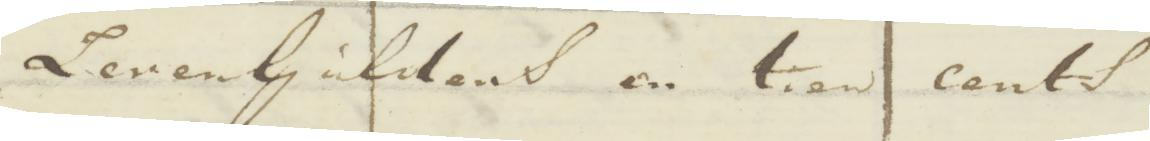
Zeven Guldens en tien cents
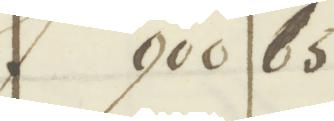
ƒ 900 65
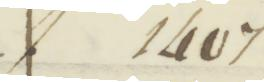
ƒ 1407
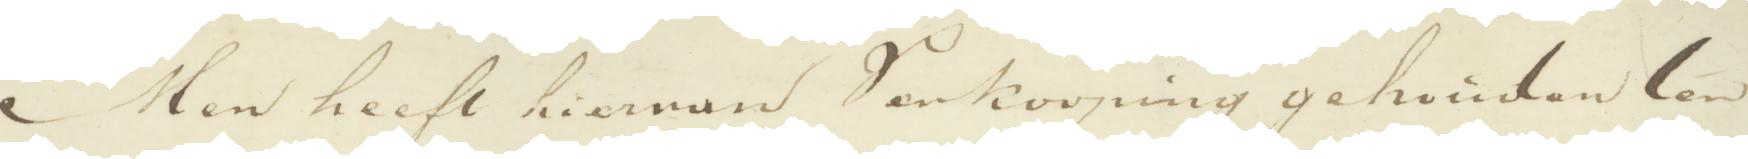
Men heeft hiervan Verkooping gehouden ten
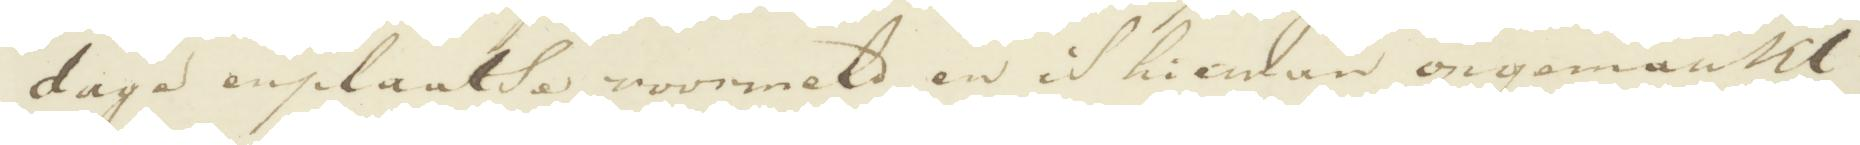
dage en plaatse voormeld, en is hiervan opgemaakt
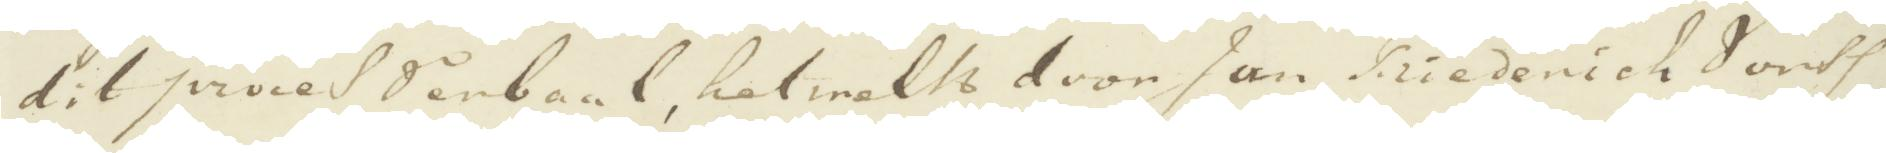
dit proces Verbaal, het welk door Jan Friederich Vorss,
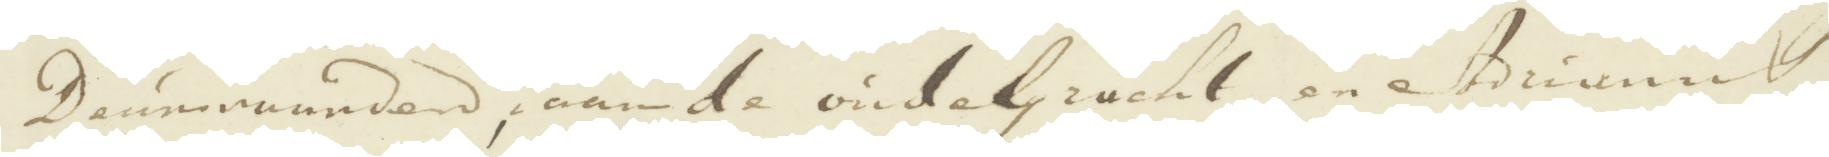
Deurwaarder, aan de oude Gracht en Adrianus
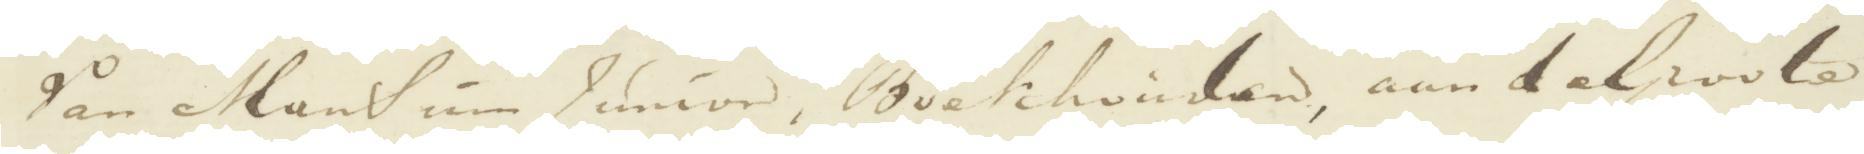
Van Mansum Junior, Boekhouder, aan de Groote
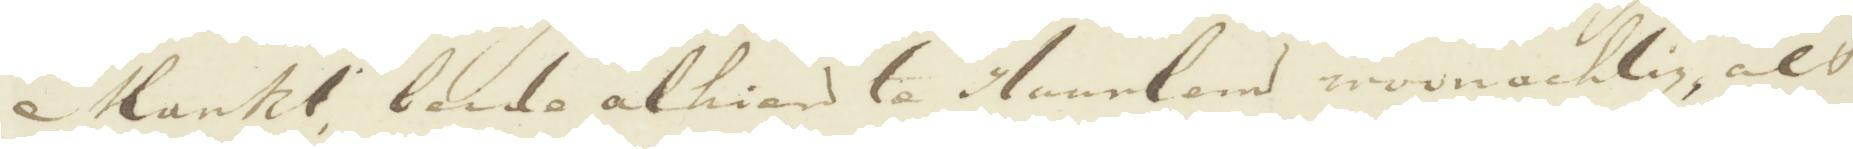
Markt, beide alhier te Haarlem woonachtig, als
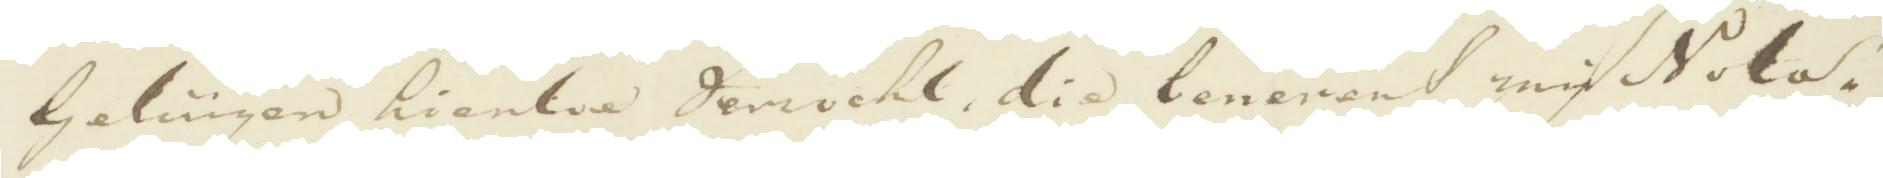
Getuigen hiertoe Verzocht, die, benevens mij Nota„
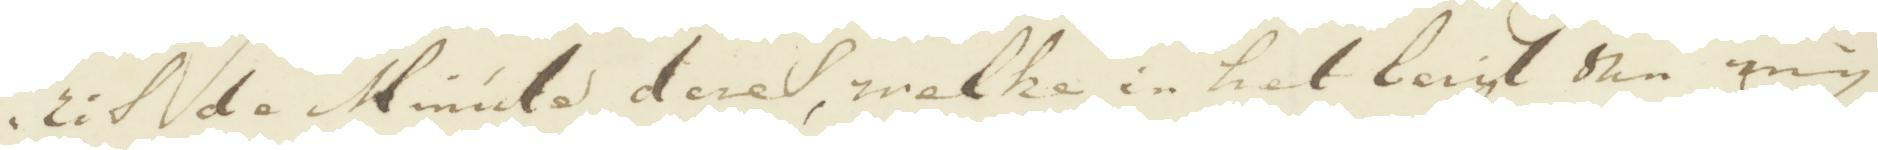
„ris de Minute dezes, welke in het bezit van mij
